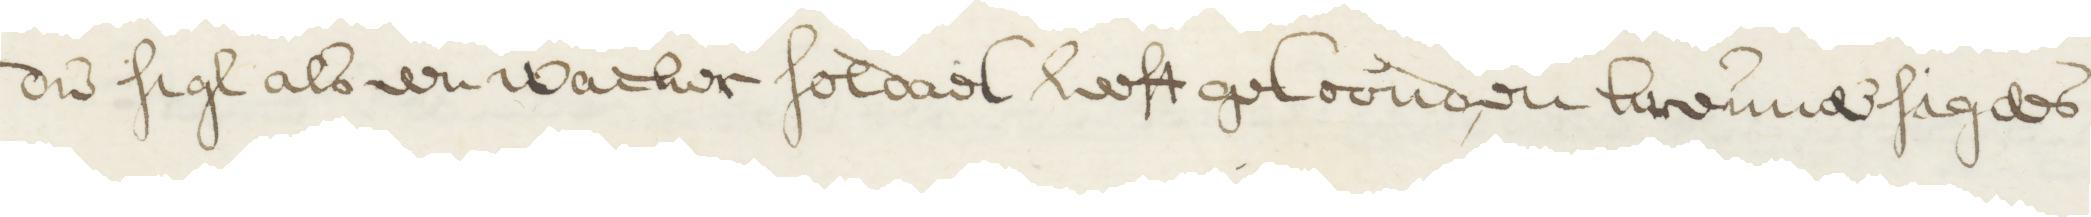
die sigh als een wacker soldaet heeft getoond, en kreunde sig des
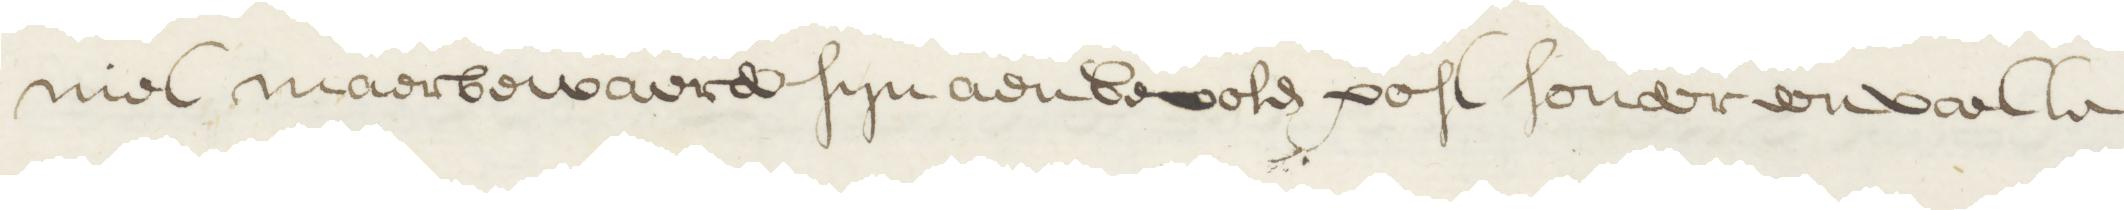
niet maer bewaerde sijn aenbevolen post sonder een voet te
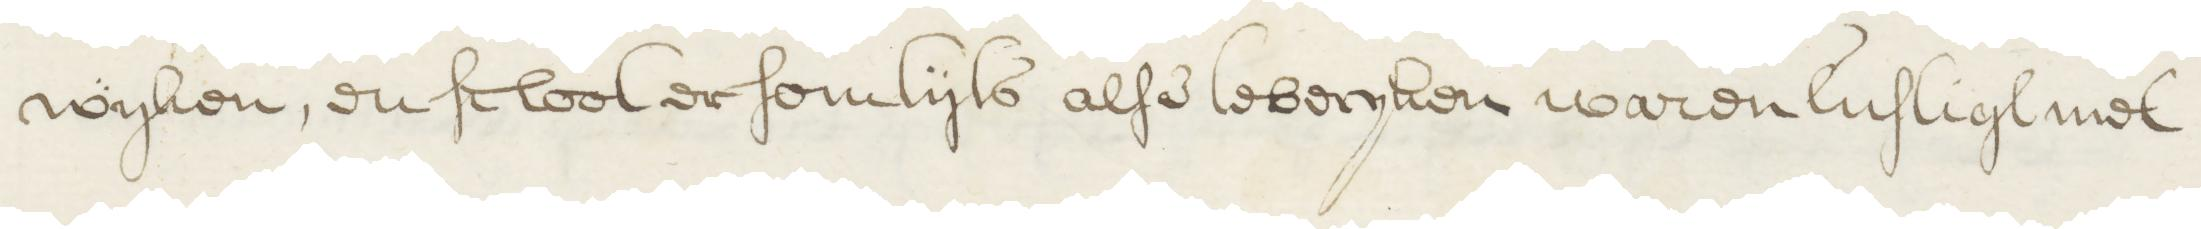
wyken, en schoot er somtijts alse te beryken waren lustigh met
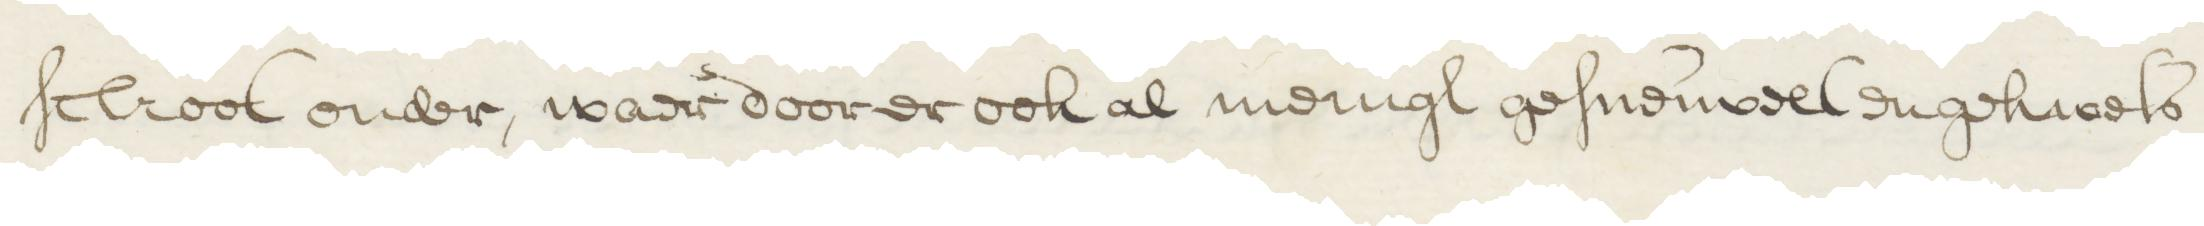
schroot onder, waer door er ook al menigh gesneuvelt en gekwets
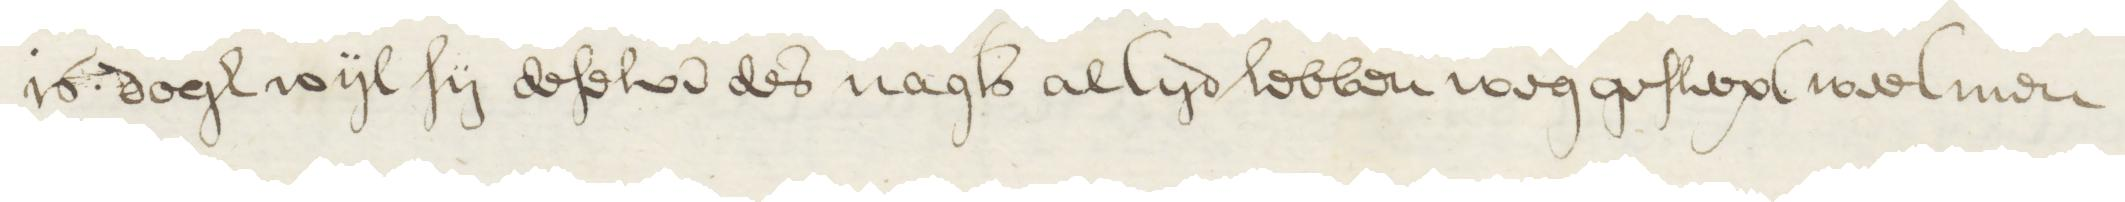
is dogh wijl sij deselve des nagts altyd hebben weg gesleept weet men
